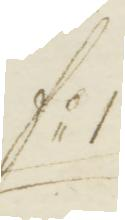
f„o 1
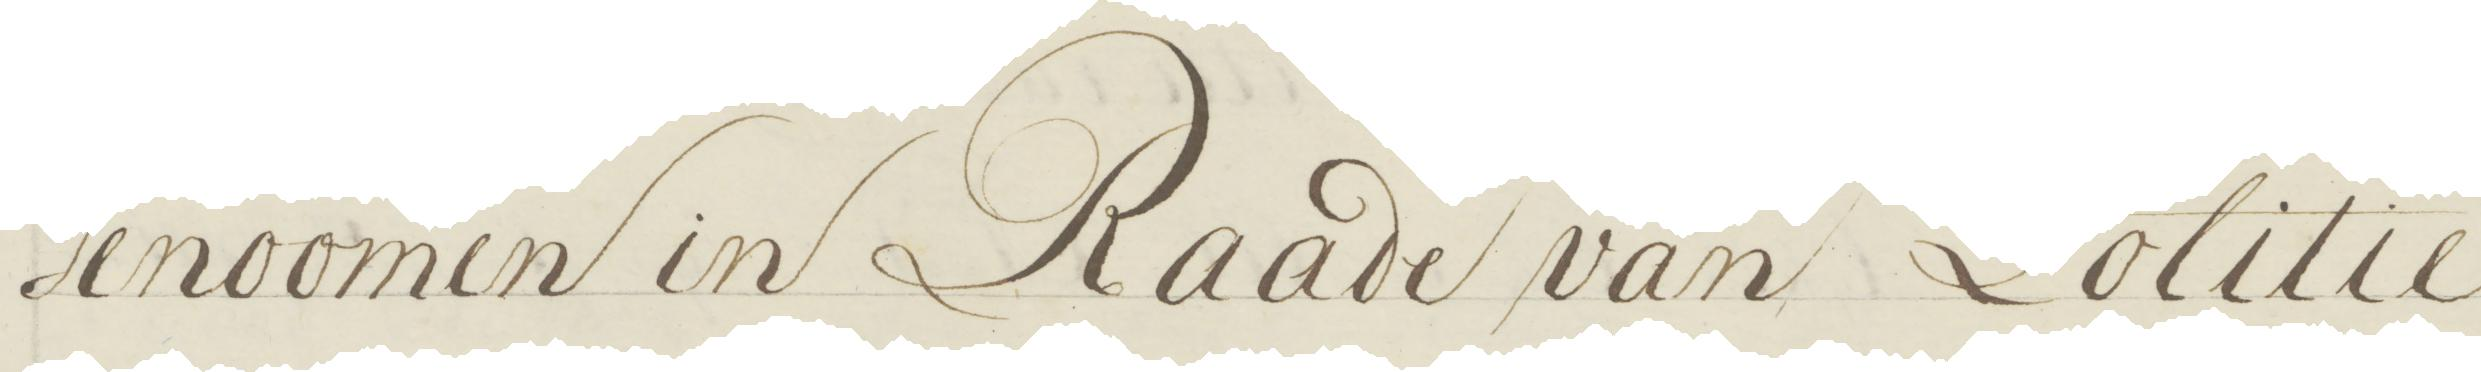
Genoomen in Raade van Politie
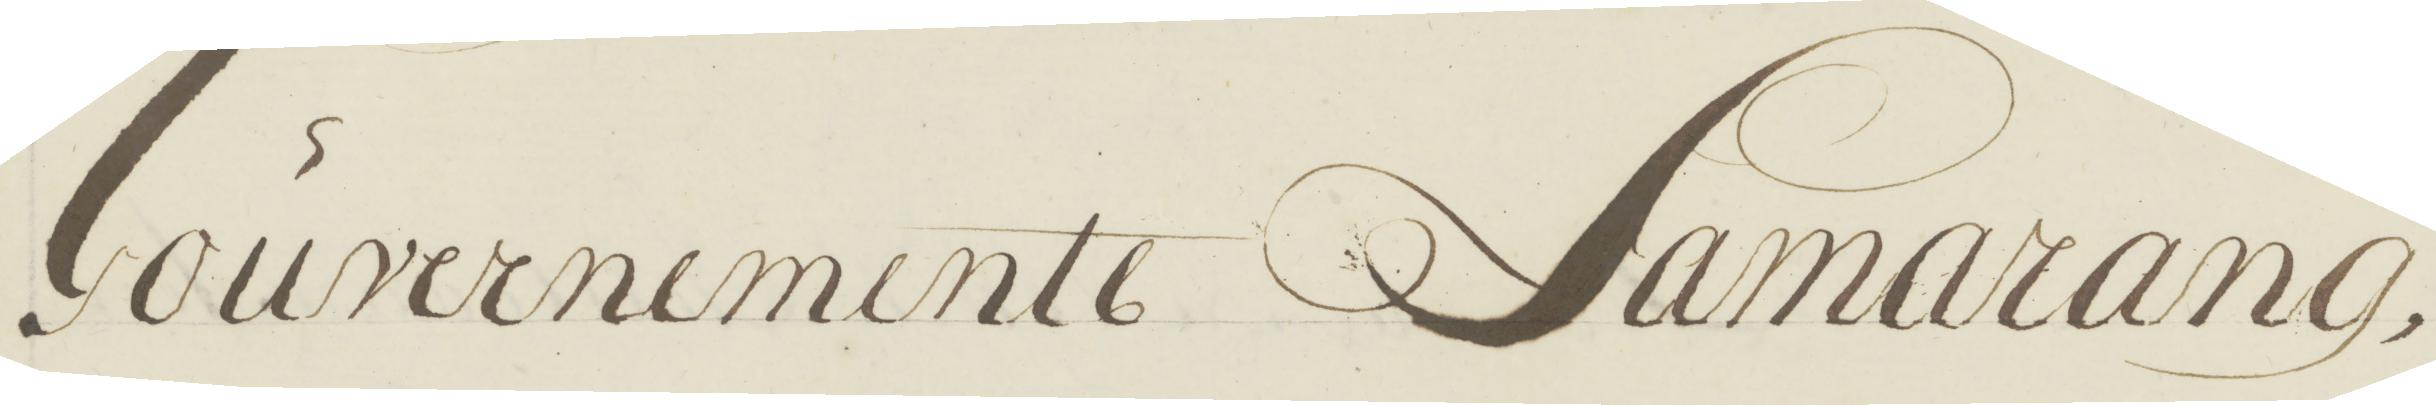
Gouvernemente Samarang,
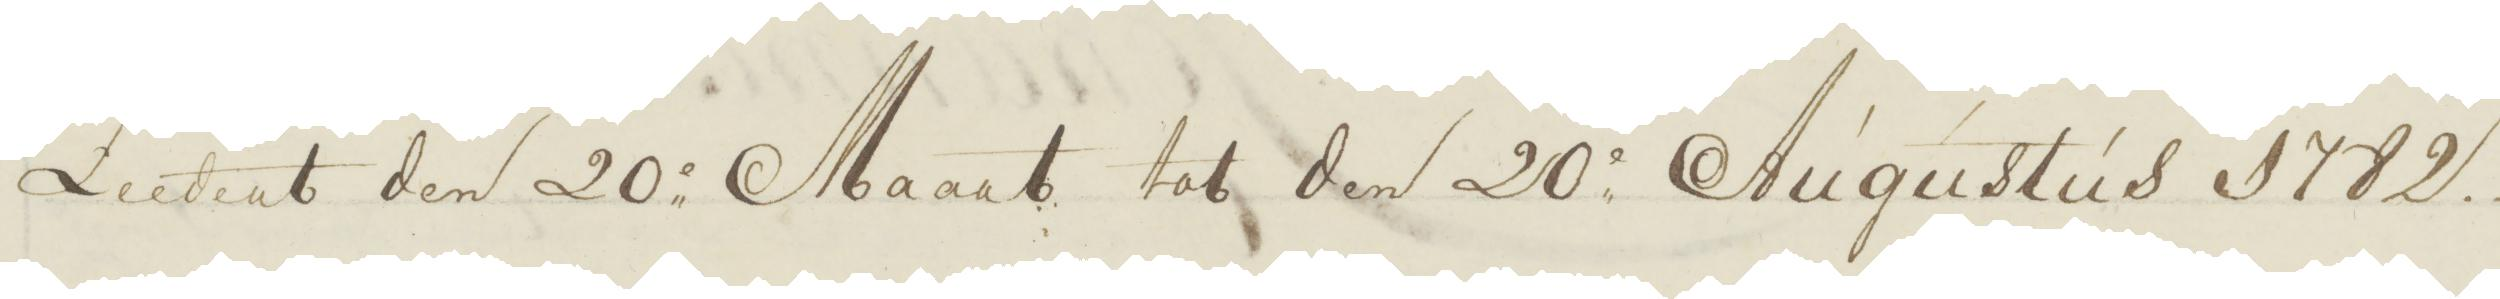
Zeedert den 20„e Maart tot den 20„e Augustus 1782.
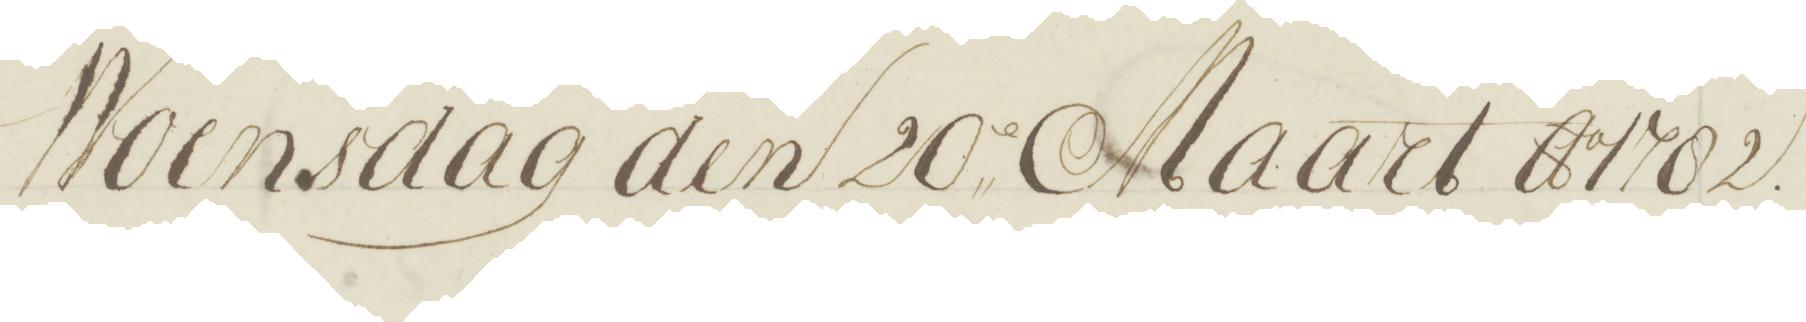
Woensdag den 20„e Maart Ao 1782.
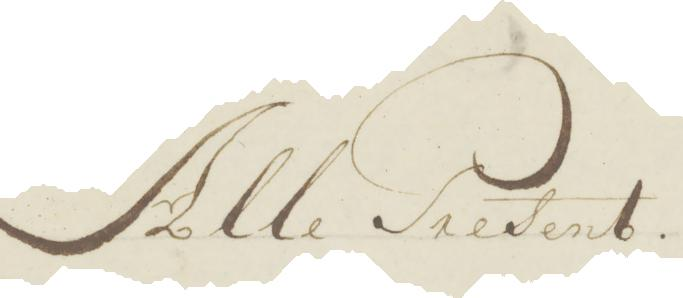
Alle Present.
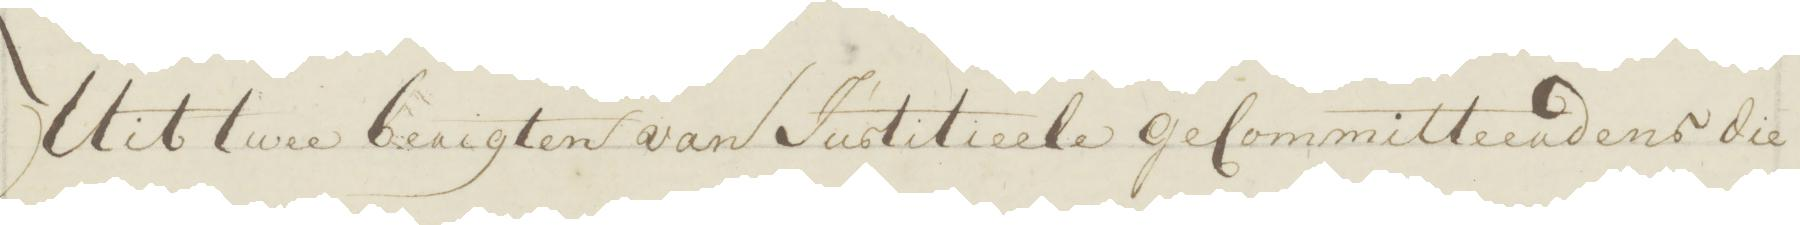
Uit twee berigten van Justitieele gecommitteerdens die
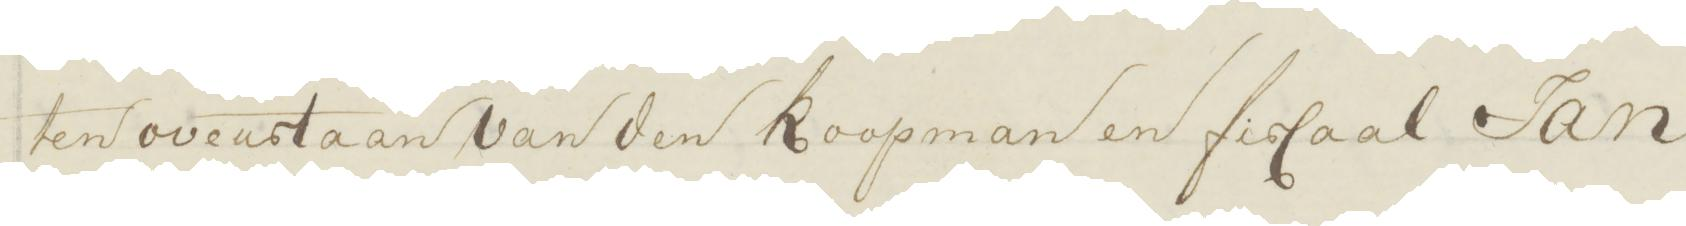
ten overstaan van den koopman en fiscaal Jan
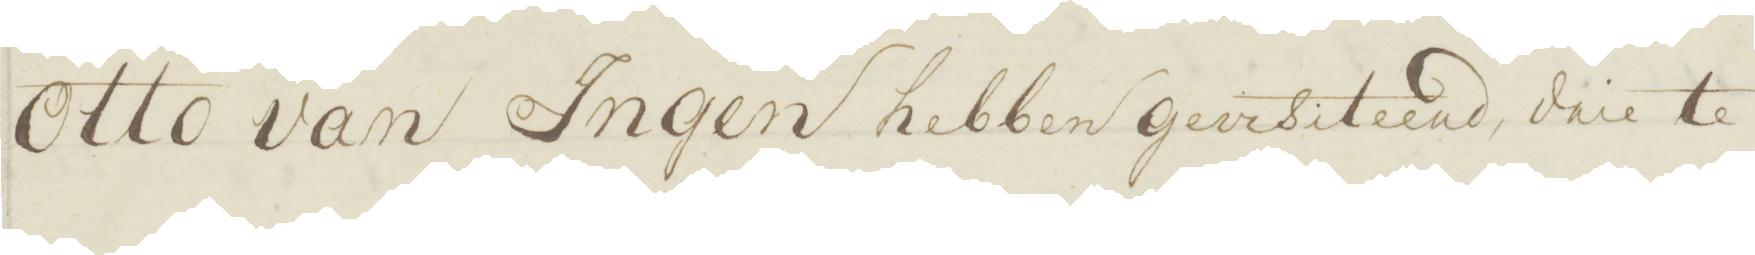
Otto van Jngen hebben gevisiteerd, drie te
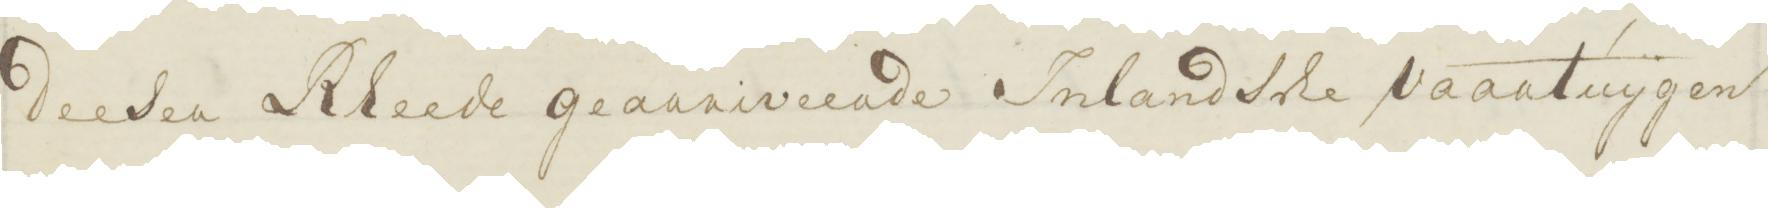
deeser Rheede gearriveerde Jnlandsche vaartuijgen
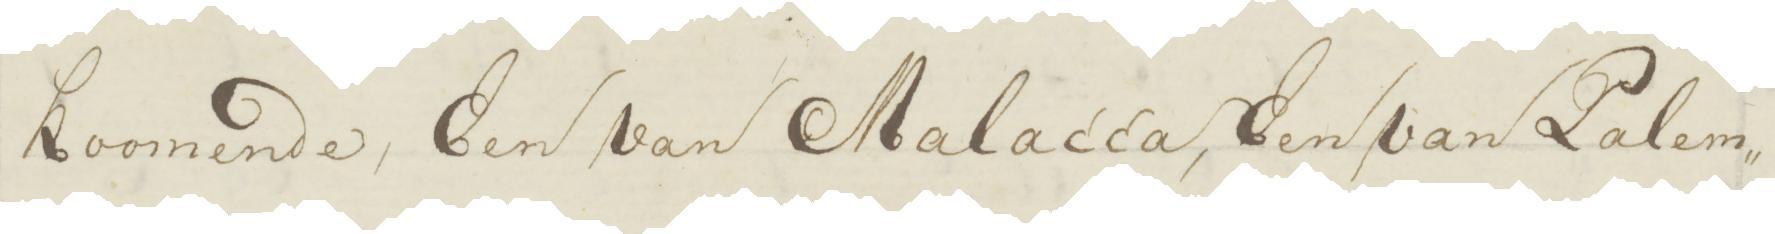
koomende, Een van Malacca, Een van Palem„
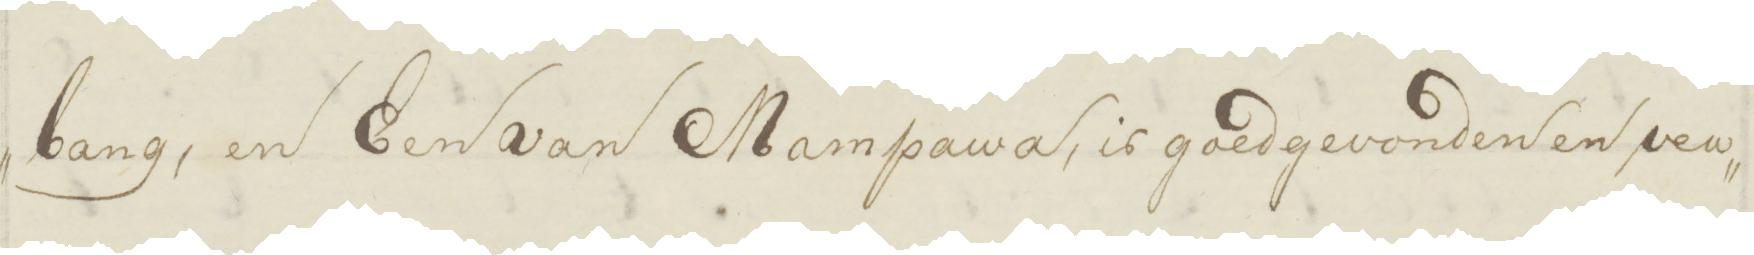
bang, en Een van Mampawa, is goedgevonden en ver„
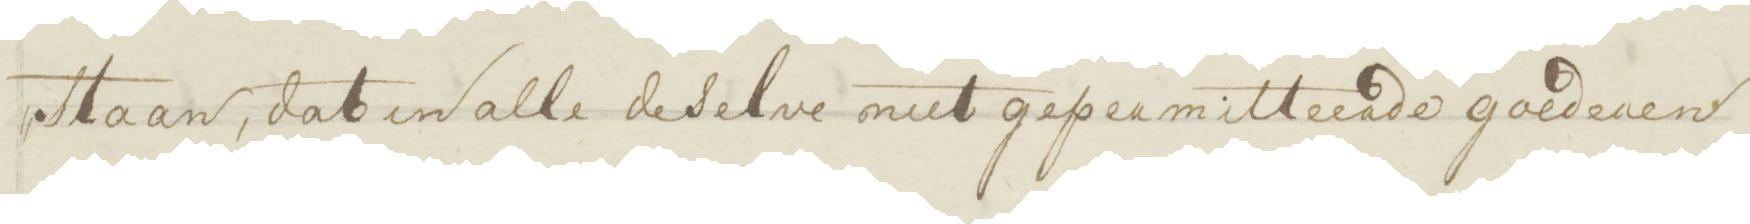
„staan, dat in alle deselve niet gepermitteerde goederen
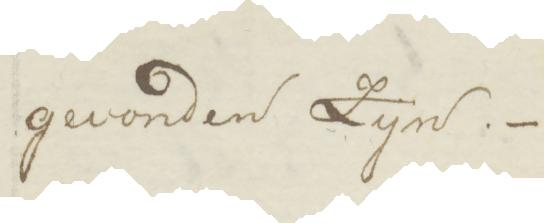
gevonden zijn. —
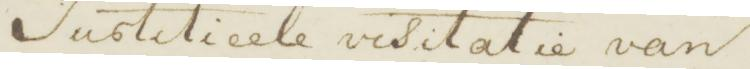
Justitieele visitatie van
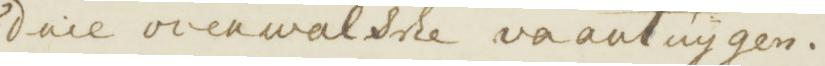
drie overwalsche vaartuijgen.
